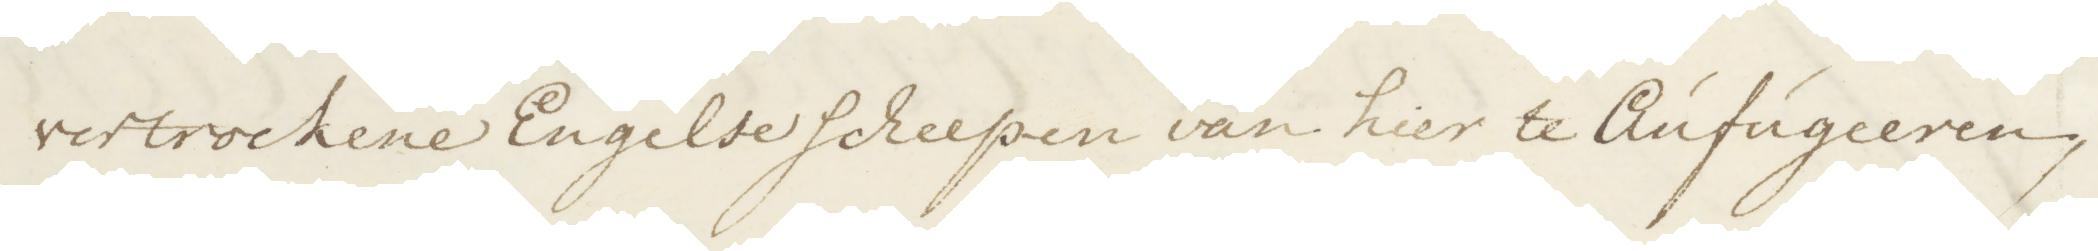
vertrockene Engelse scheepen van hier te aufugeeren,
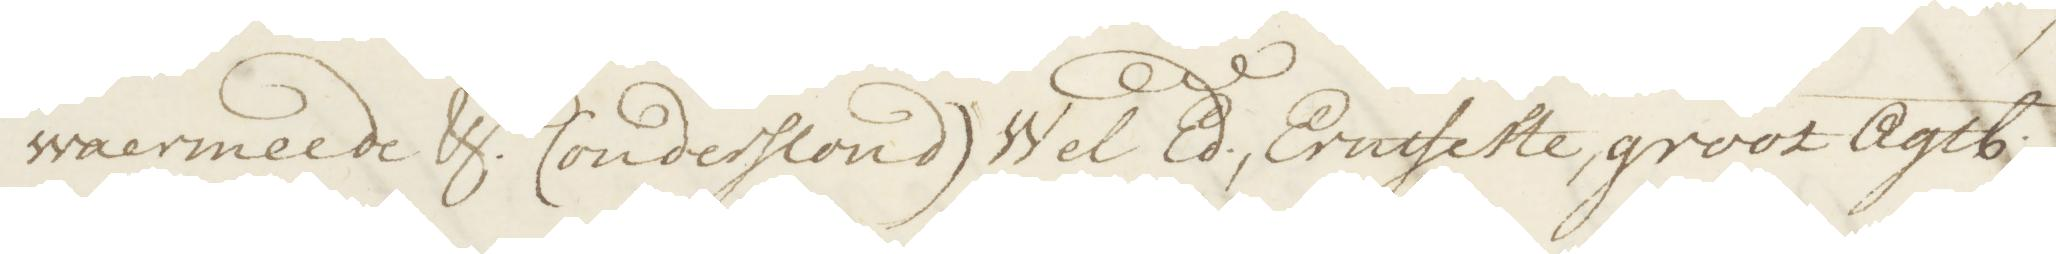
waermeede &.a (onderstond) Wel Ed., Erntfeste, groot Agtb:
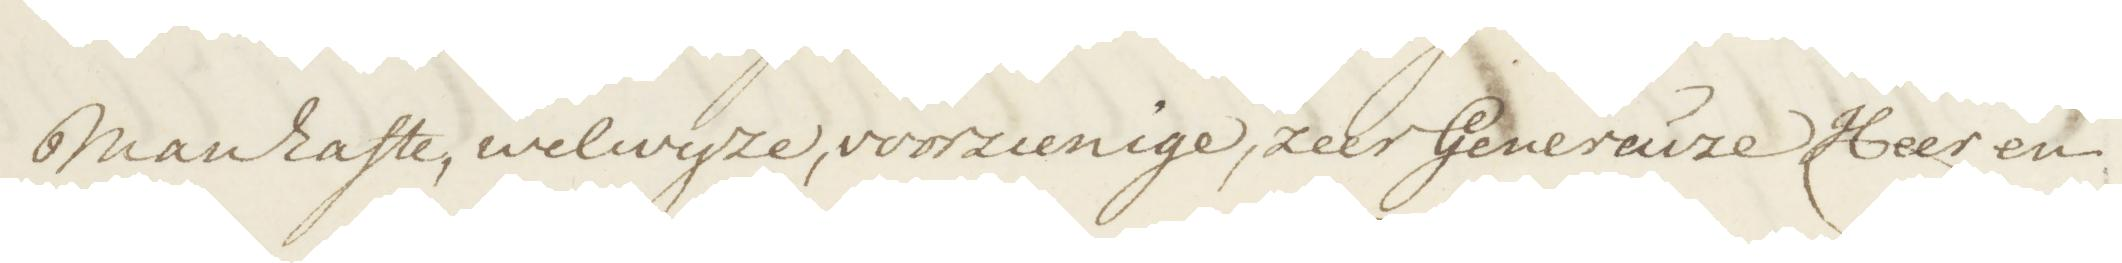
manhafte, welwyze, voorzienige, zeer Genereuze Heer en
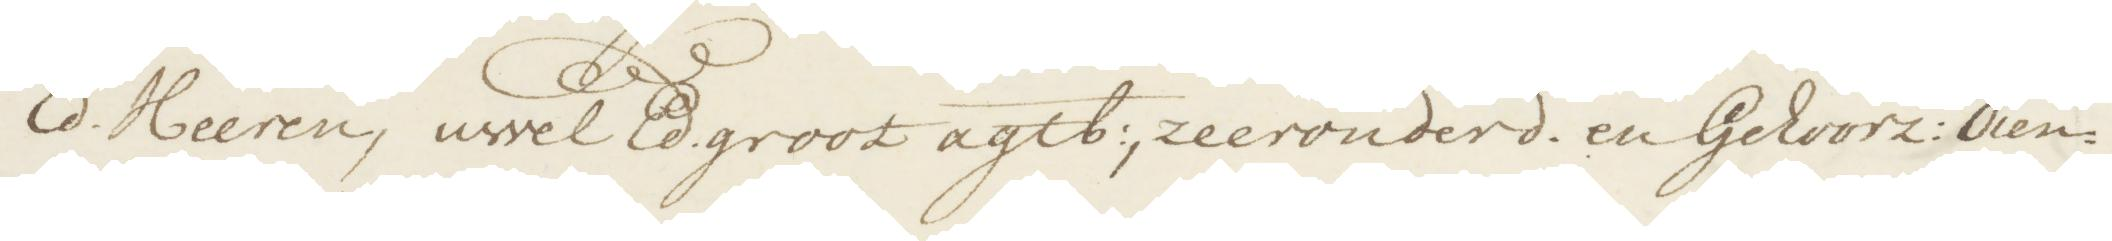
Ed.le Heeren, uwel Ed. groot agtb:, zeer onderd. en Gehoorz:me dien:ren
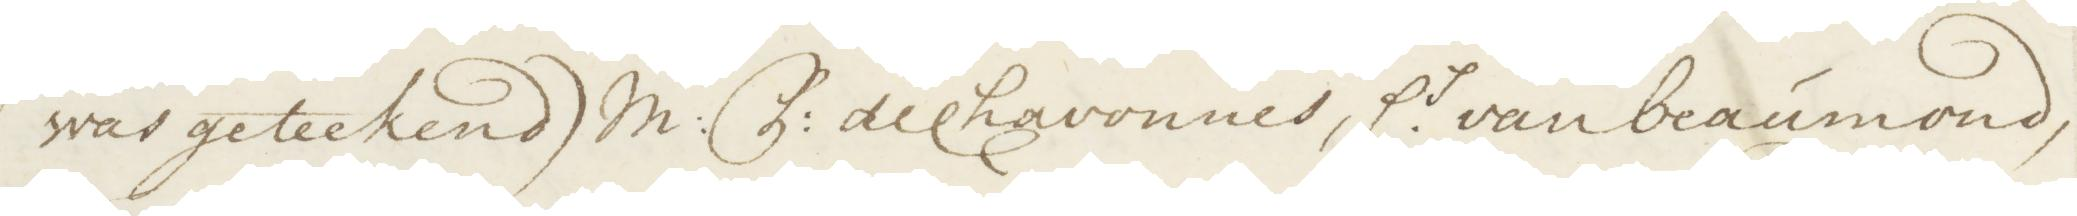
was geteekend) M: P: de chavonnes, C.s van beaumond,
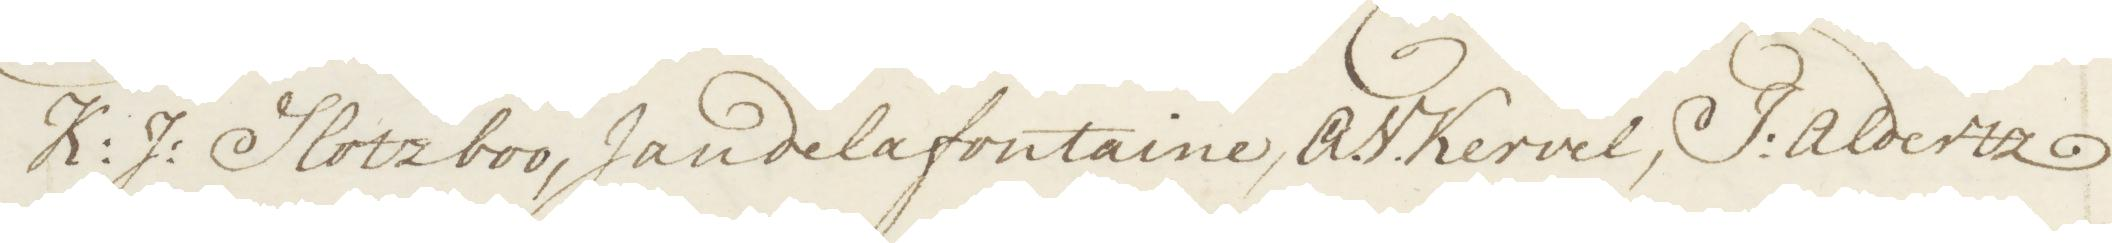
K: J: Slotzboo, Jan delafontaine, A.V. Kervel, I: aldertz
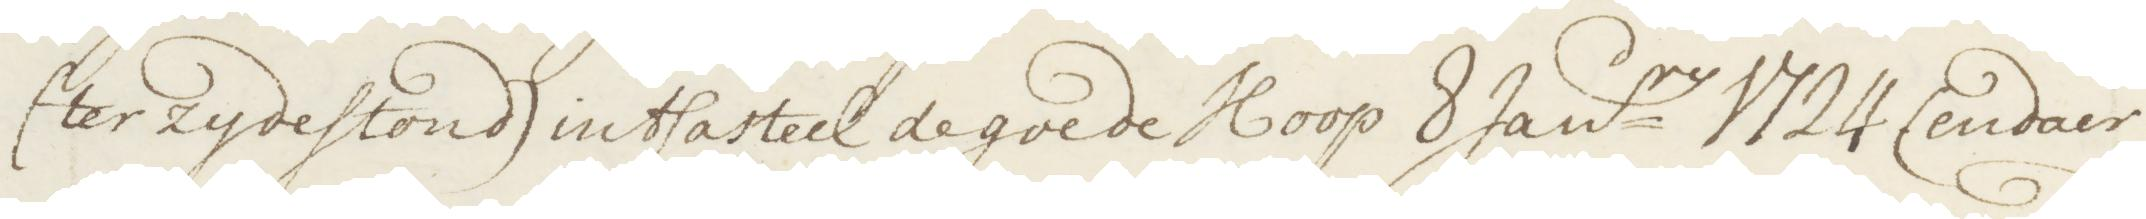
(ter zydestond) int Casteel de goede Hoop 8 Jan=ry 1724. (en daer
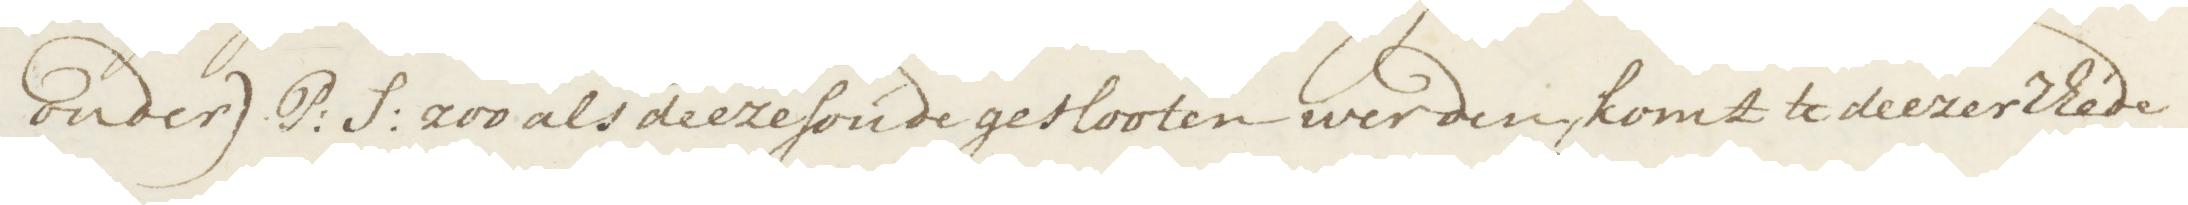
onder) P: S: zoo als deeze soude geslooten werden, komt te deezer rhéde
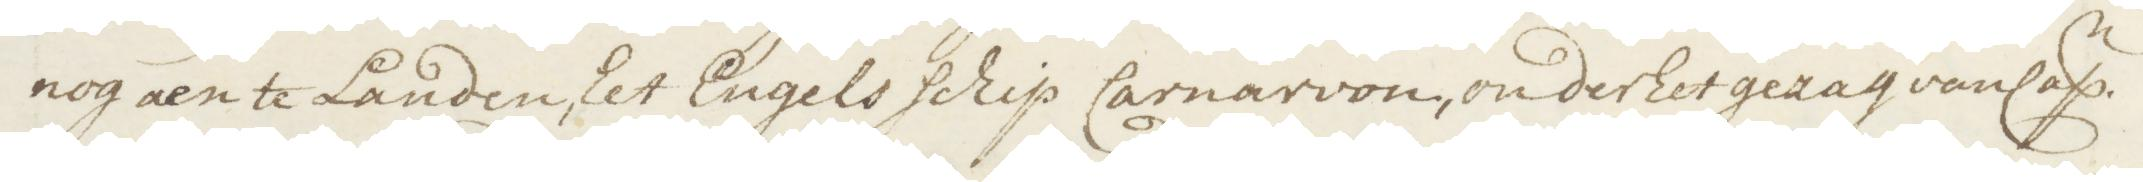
nog aen te Landen, het Engels schip Carnarvon, onder het gezag van Cap.n
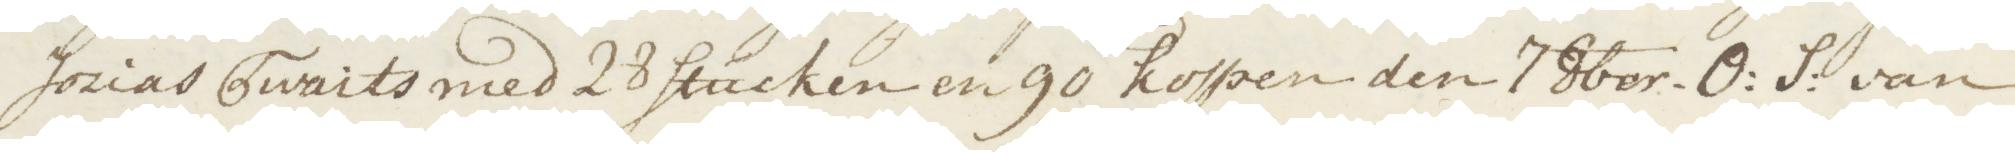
Jozias Twaits med 28 stucken en 90 koppen den 7 8ber. O: S: van
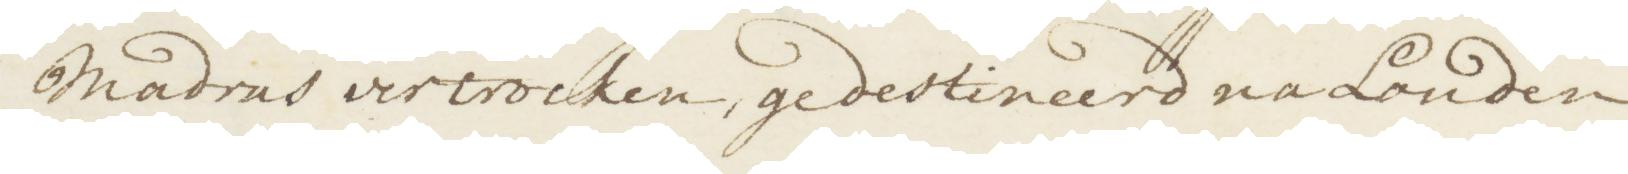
Madrus vertrocken, gedestineerd na Londen
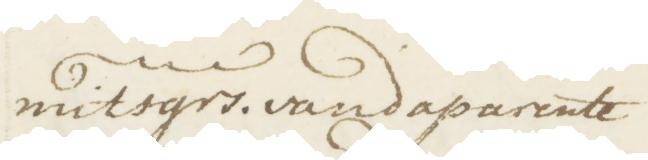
mitsgrs. vand aparente
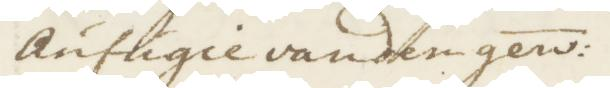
aufugie van den gew:
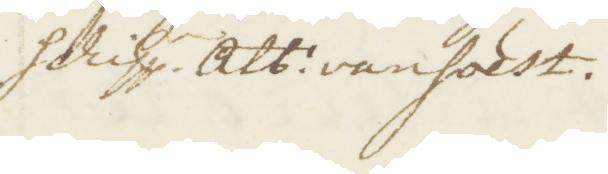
schipp.r alb.t van soest.
